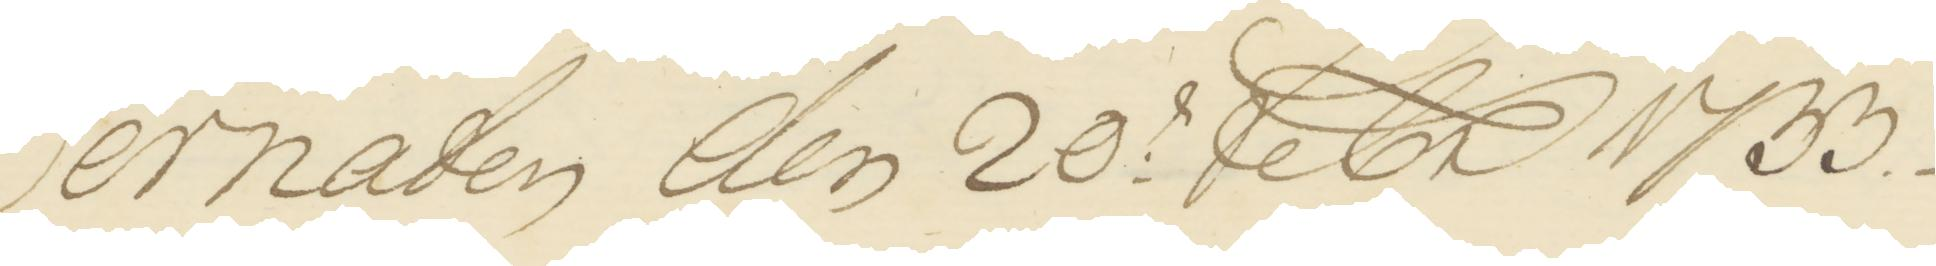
Ternaten den 20:en febr 1733.
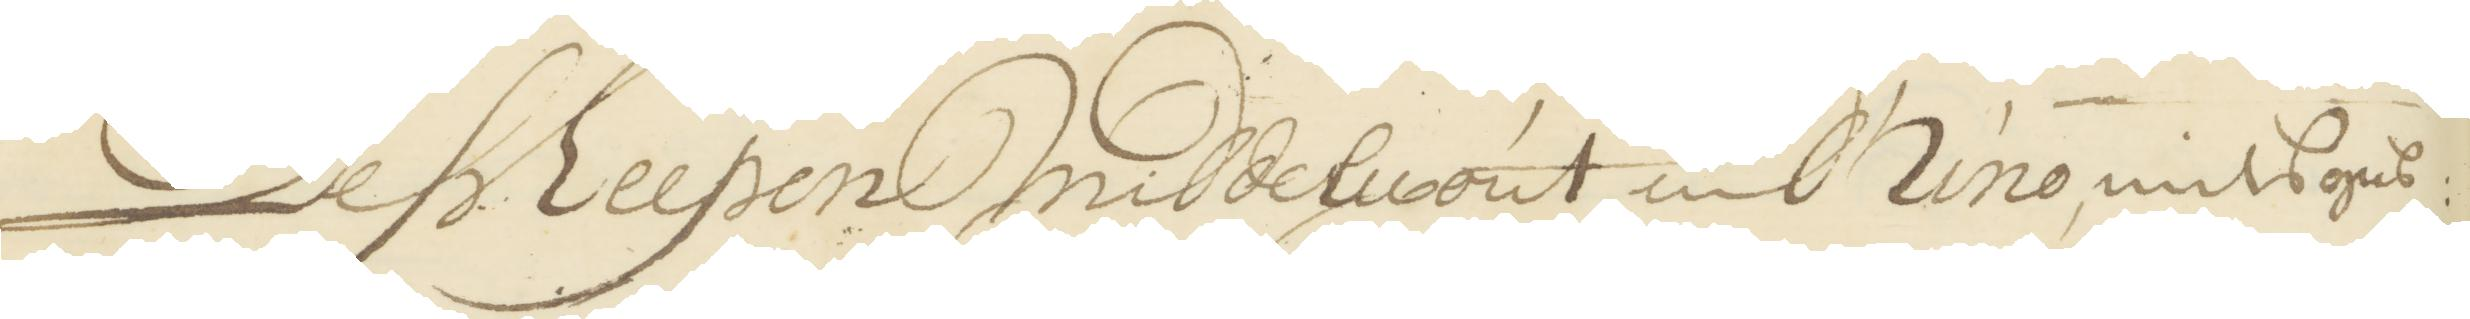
De scheepen middelwout, en d' uno, mitsgrs:
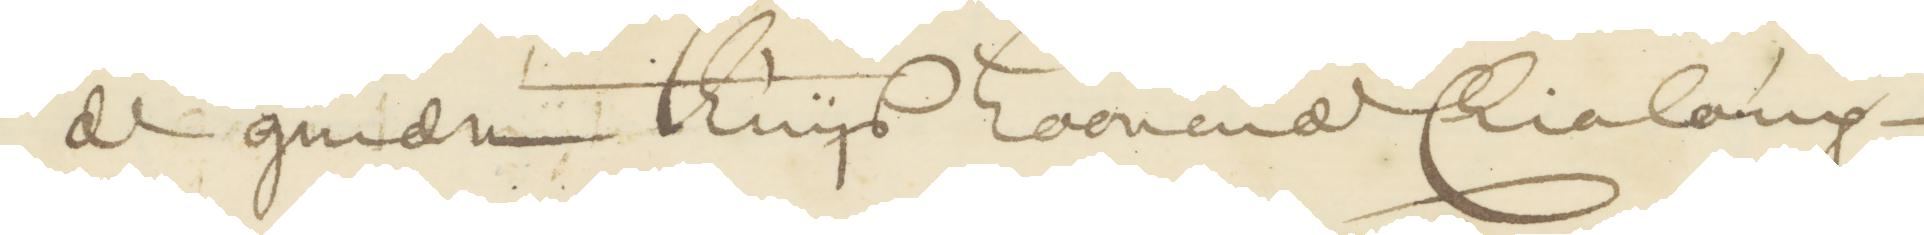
de ginder thuijs hoorende Chialoup
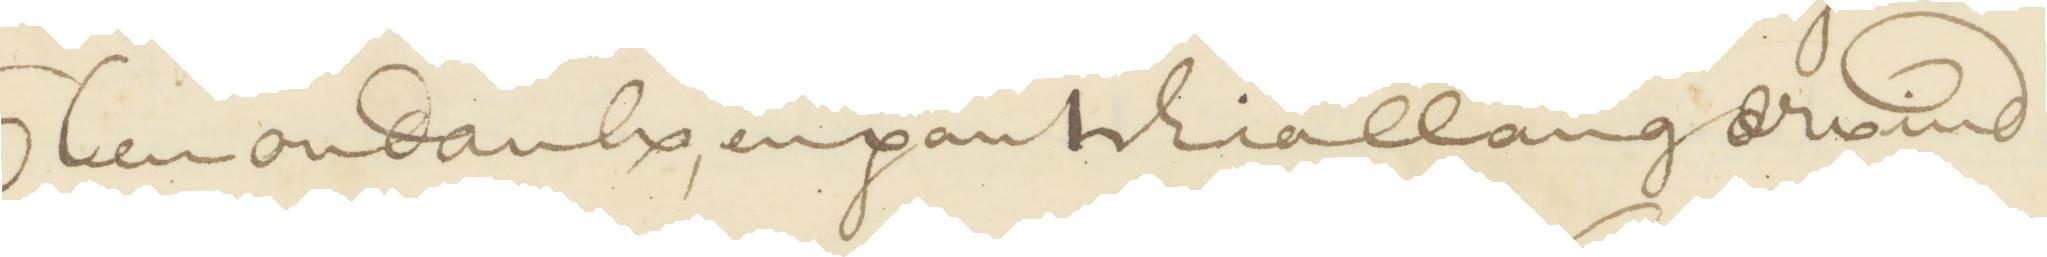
Den ondank, en pantchiallang de wind
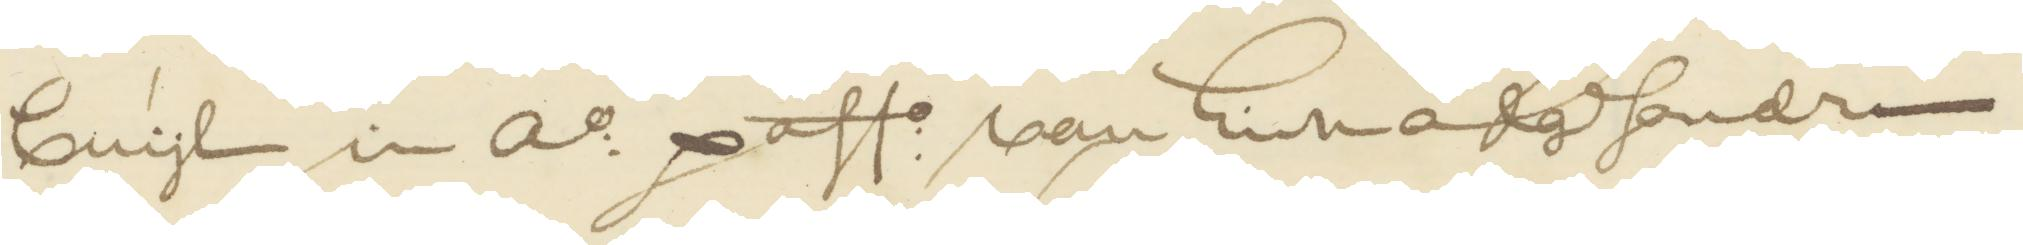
buijl in a:o paff:o van hier afgesonden
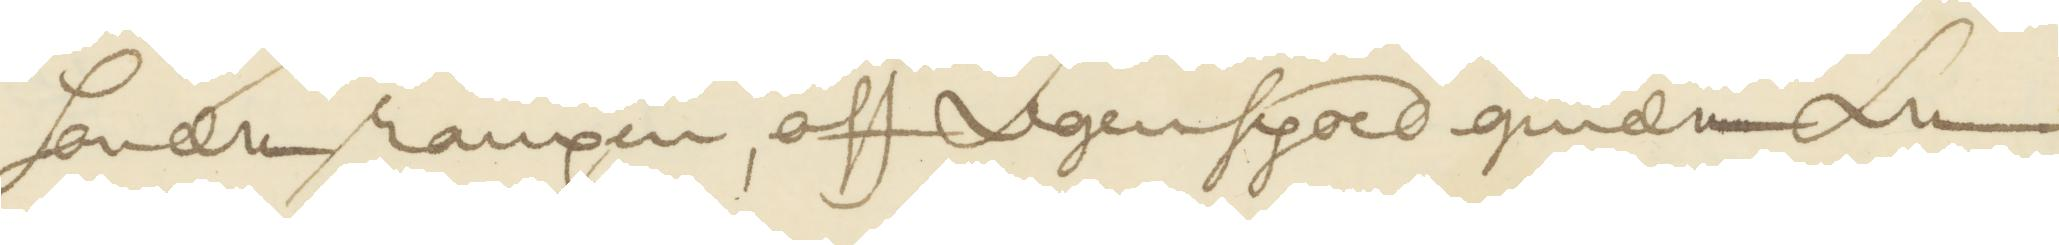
sonder rampen, off Tegenspoed ginder Ten
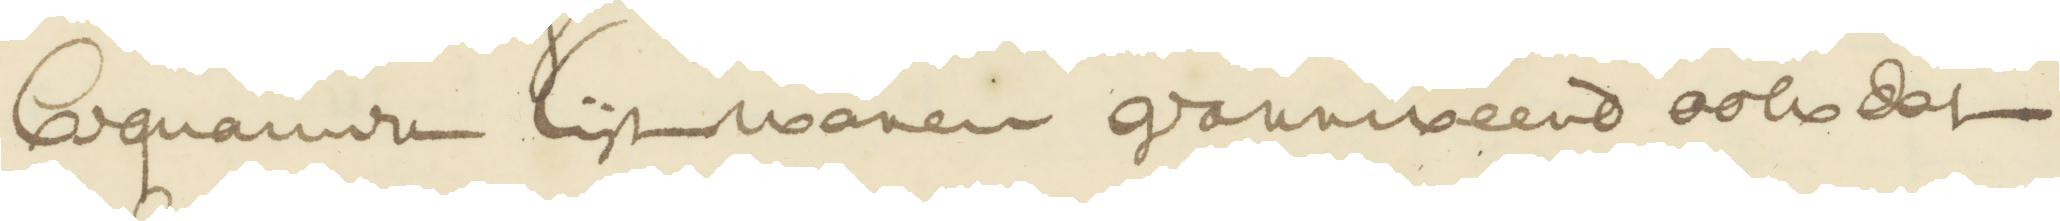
bequamen tijt waren gearriveerd, ook dat
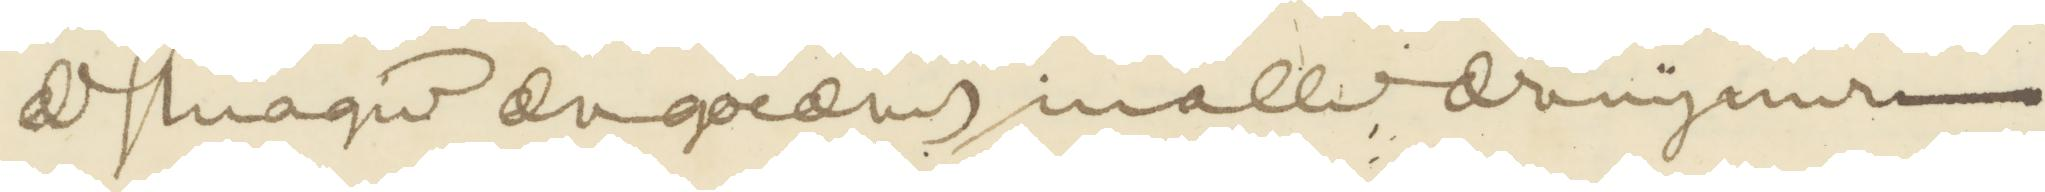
de stuagie der goederen in alle de ruijmen
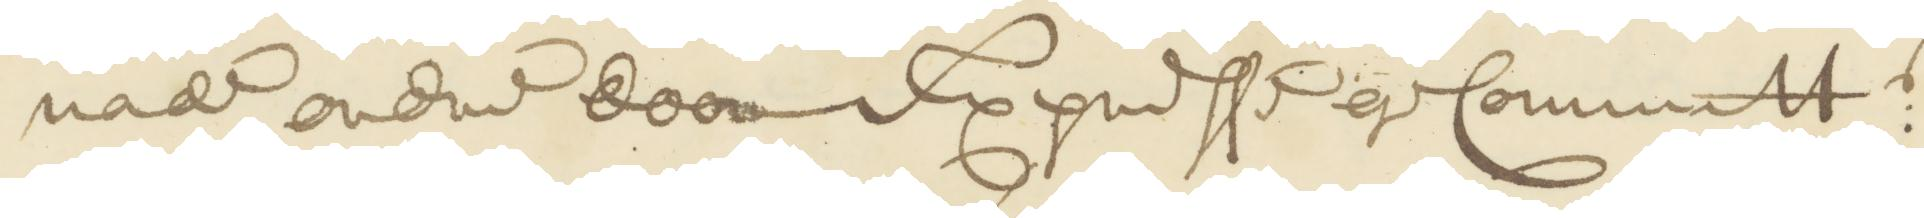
nade ordre door Expresse gecommitt:s
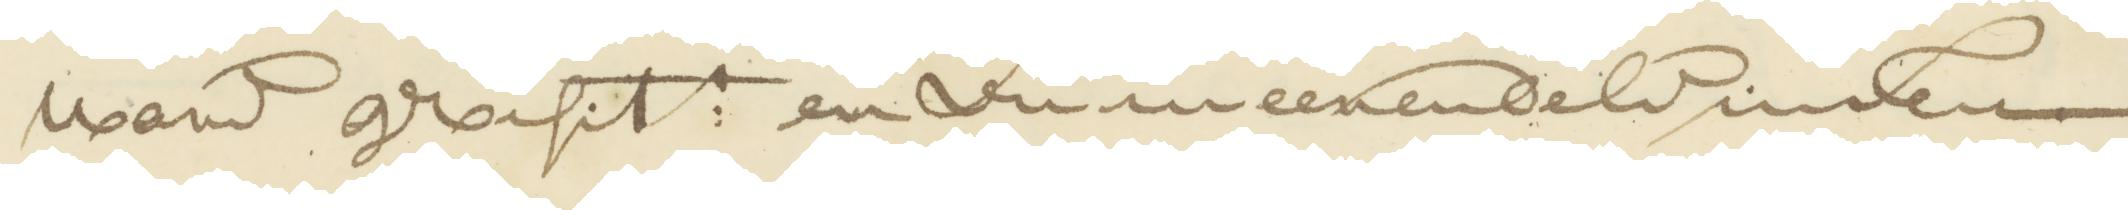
ware gevisit:t en Ten meerendele in Een
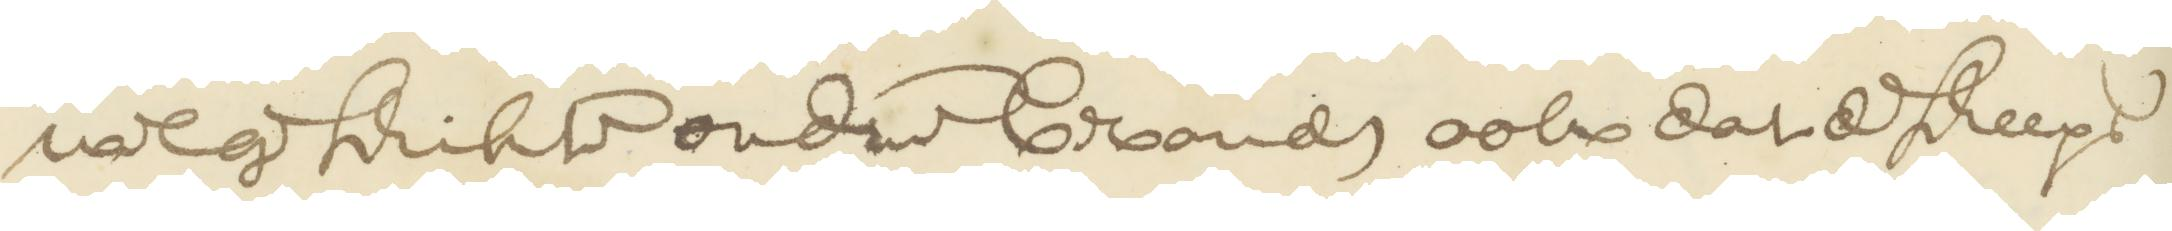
wel geschikt ordre bevonden ook dat de Scheeps
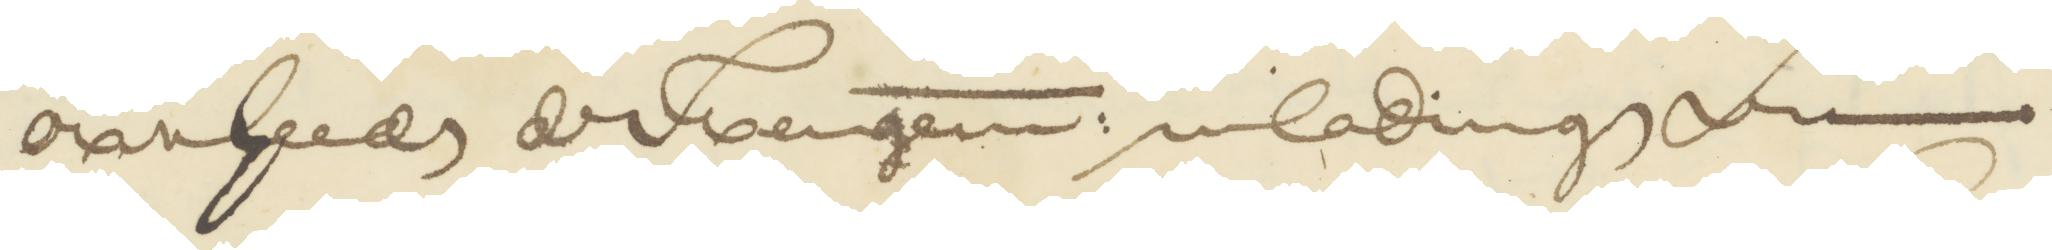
overheeden de Evengem: inladingen Ten
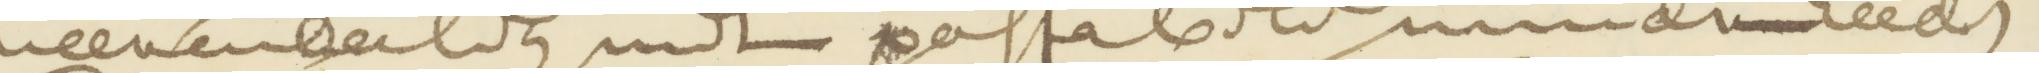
meerendeelen met passabele minderheeden
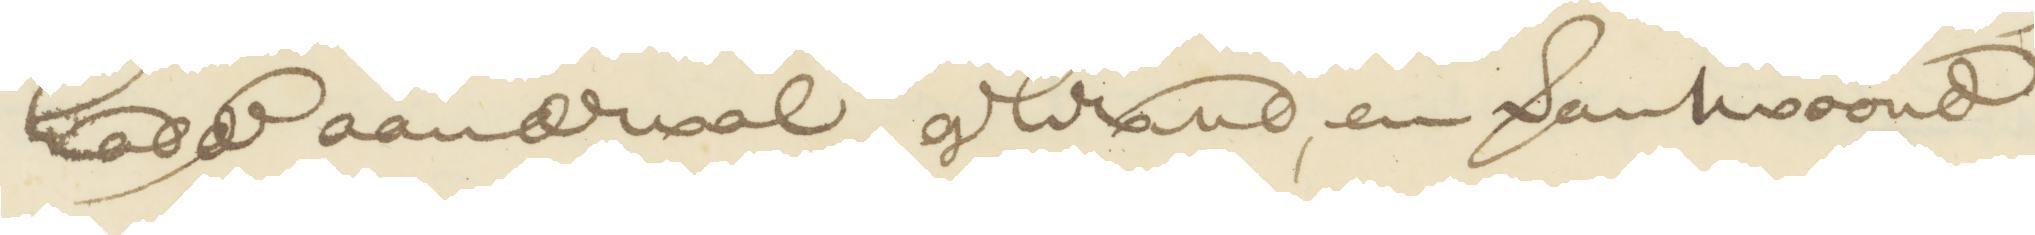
hadde aan de wal geleverd, en verantwoord
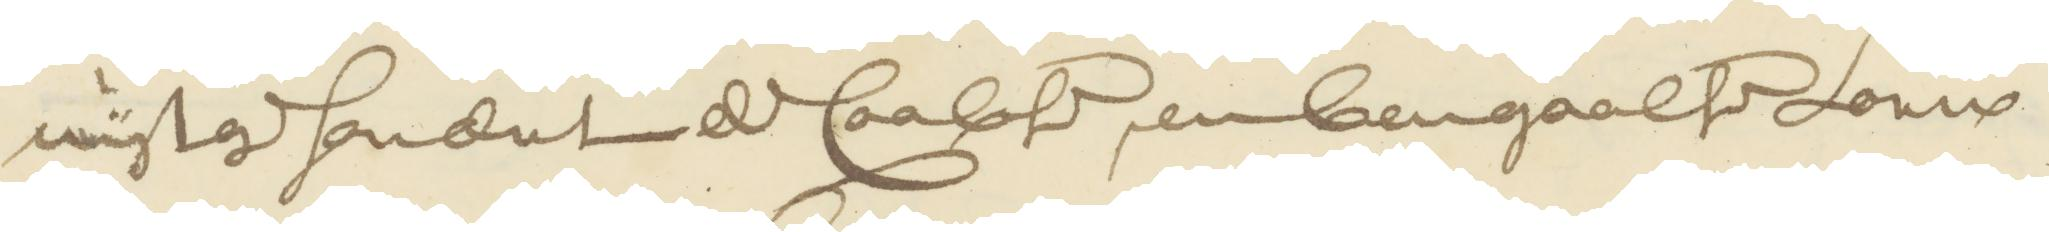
uijtgesondert de Caabse, en bengaalse Torne
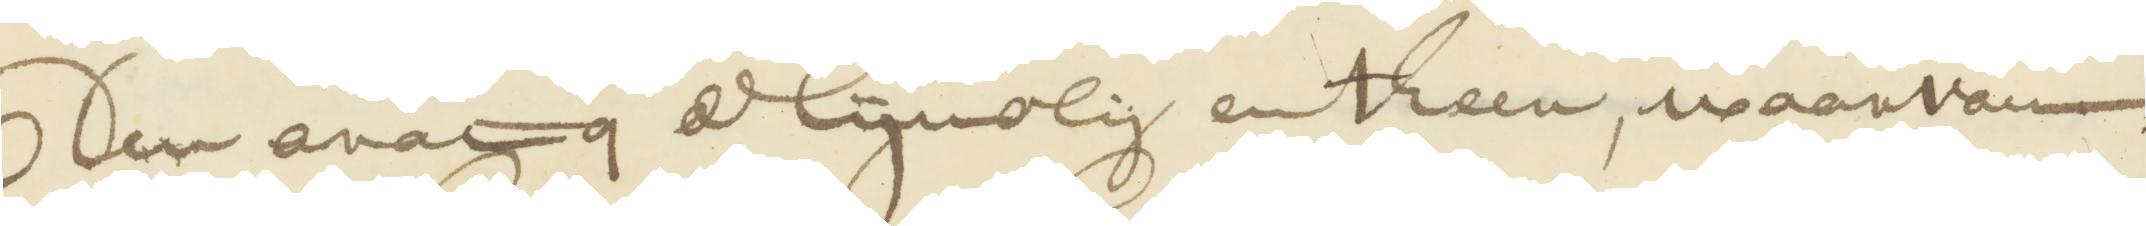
den aracq de lijnolij en theen, waarvan
